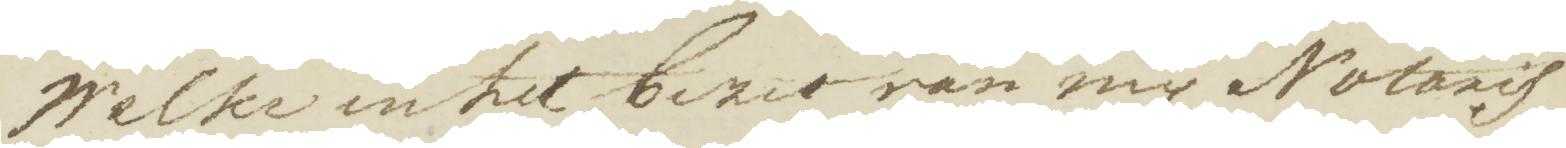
Welke in het bezit van my Notaris
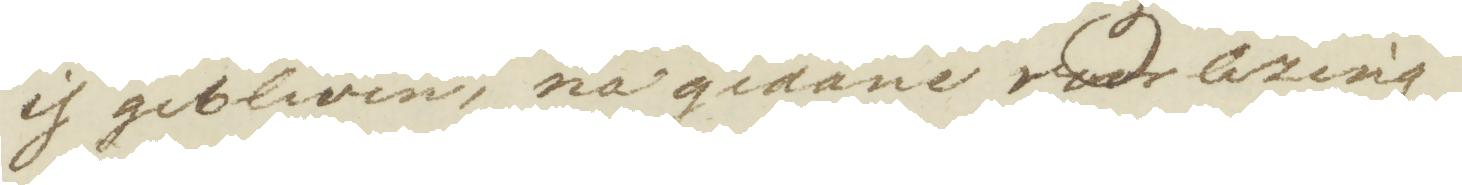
is gebleven, na gedane voorlezing
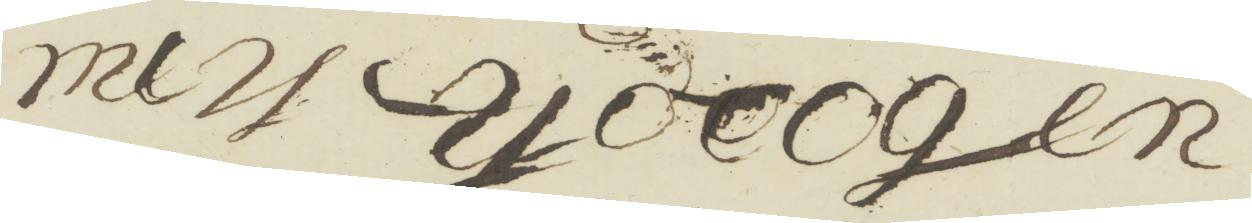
mary doogen
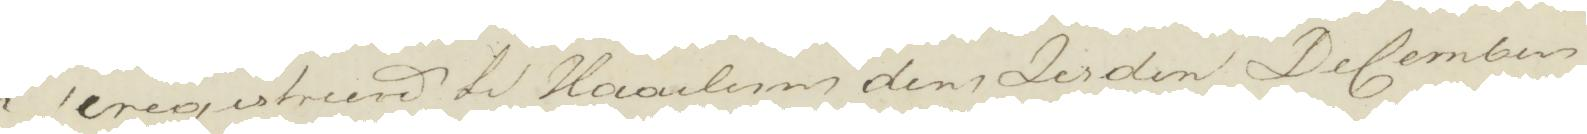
Geregistreerd de Haarlem den Zesden December
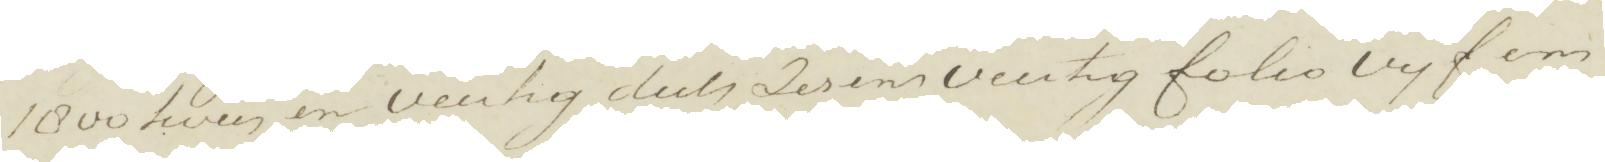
1800 twee en veertig deel zesen veertig folio vijf en
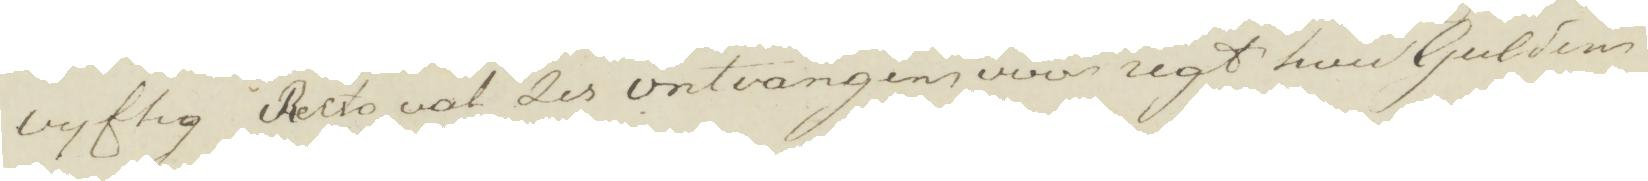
vijftig Recto vak zes ontvangen voor regt twee Gulden
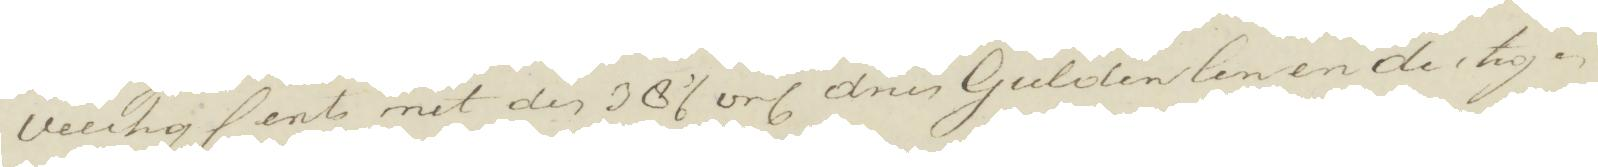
veertig Cents met de 38% onc drie Gulden Een en dertig en
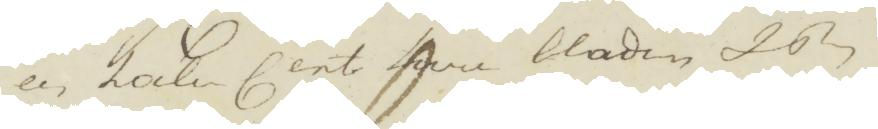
een halve Cent drie bladen zry
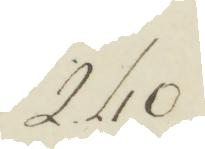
f 2.40
